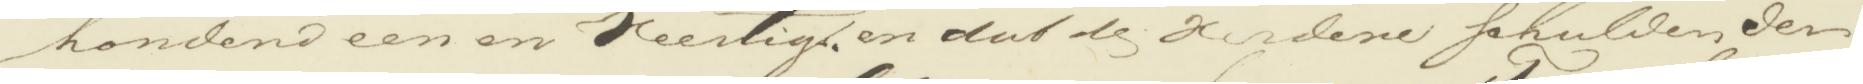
honderd een en Veertig, en dat de verdere schulden der
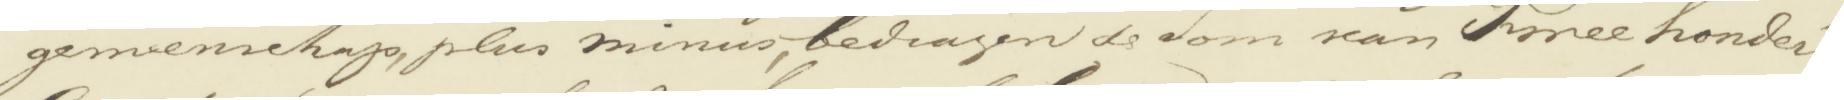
gemeenschap, plus minus, bedragen de som van Twee honderd
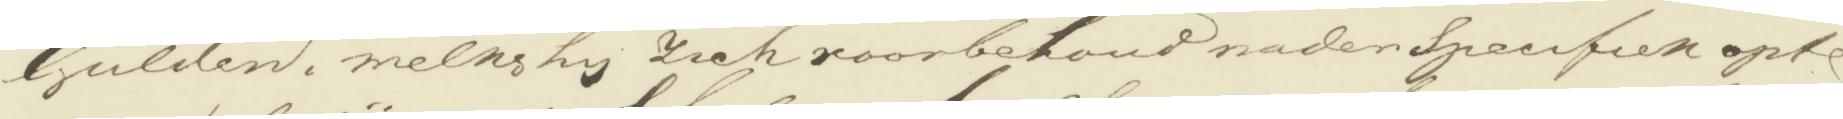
Gulden, welke hy zich voorbehoud nader specifiek opte
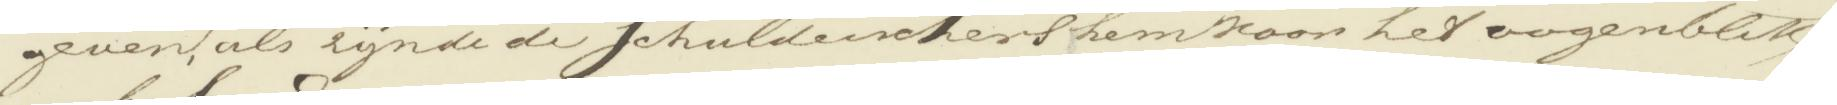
geven, als zijnde de Schuldeischers hem voor het oogenblik
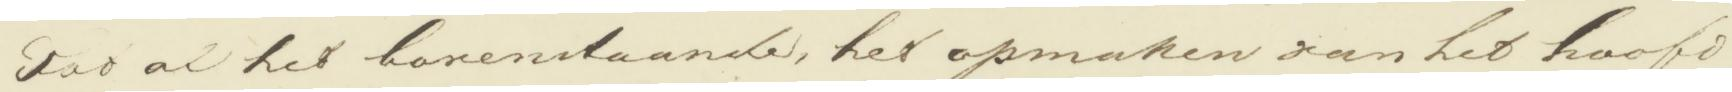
dat al het bovenstaande, het opmaken van het hoofd
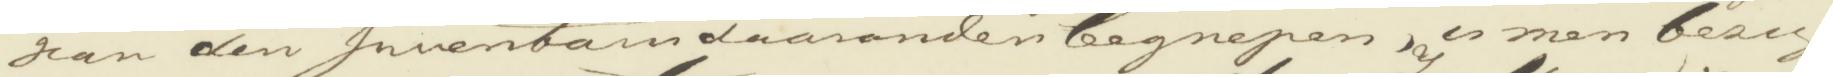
van den Jnventaris daaronder begrepen, is men bezig
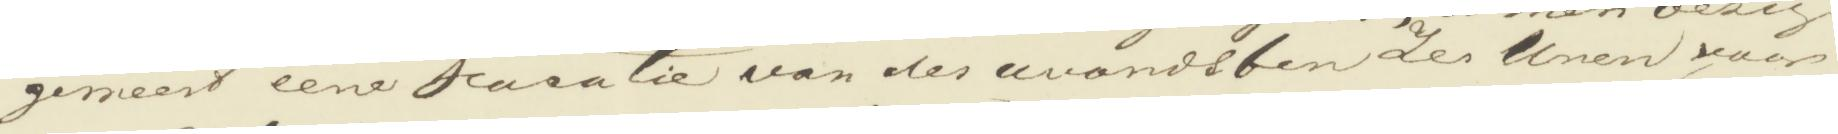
geweest eene vacatietie van des avonds ten Zes Uren voor
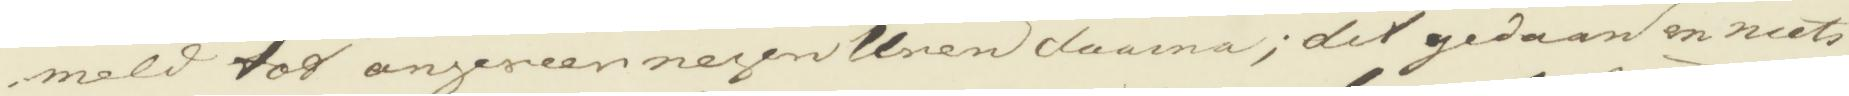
„meld tot ongeveer negen Uren daarna; dit gedaan en niets
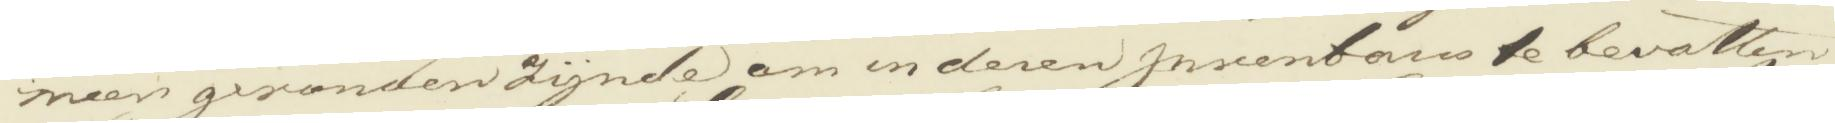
meer gevonden zijnde om in dezen Jnventaris te bevatten
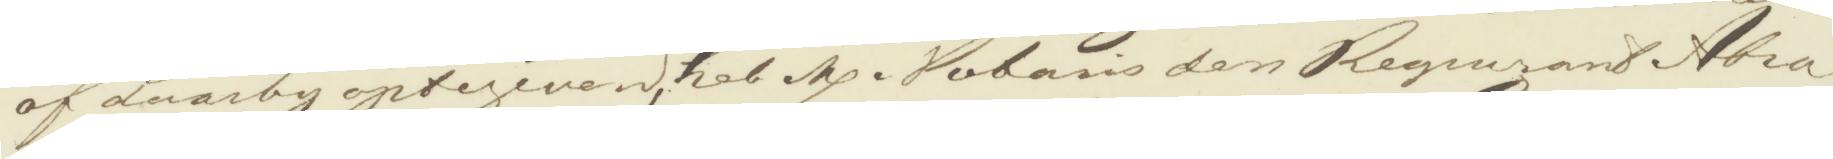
of daarby optegeven, heb ik Notaris den Requirant Abra
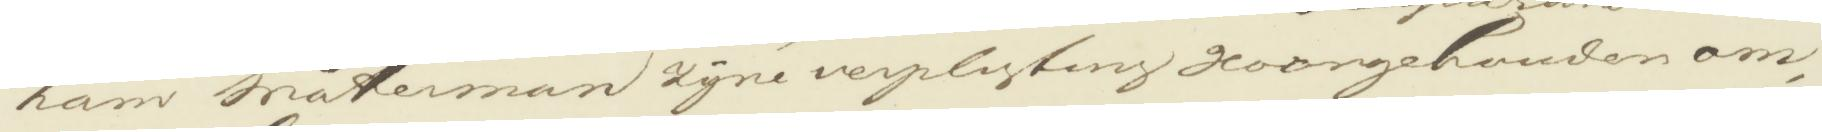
ham waterman zijne verpligting voorgehouden om,
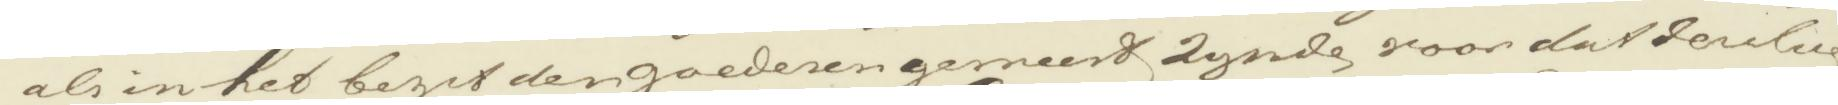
als in het bezit der goederen geweest zynde voor dat dezelve
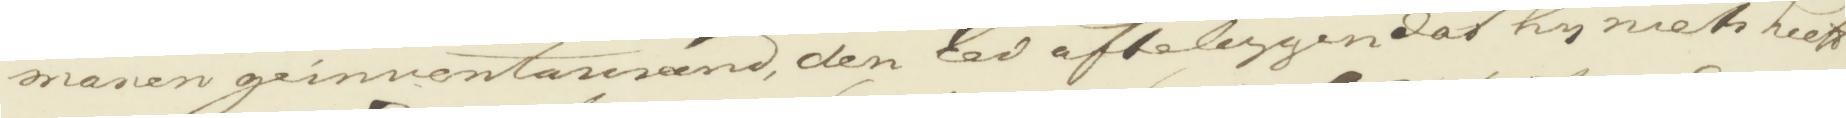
waren geinventariseerd, den Eed afteleggen dat hy niets heeft
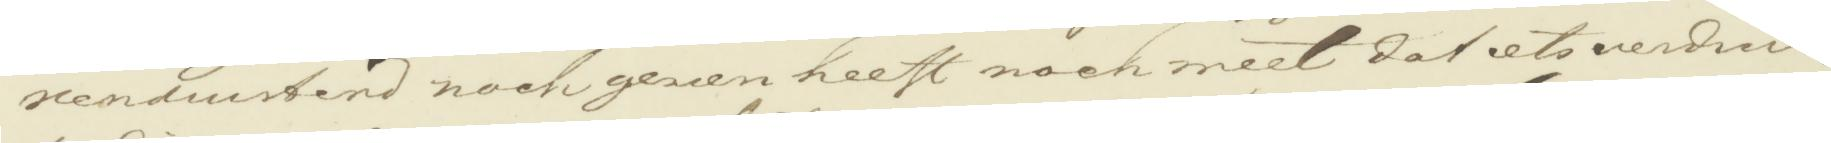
verduisterd noch gezien heeft noch weet dat iets verduis
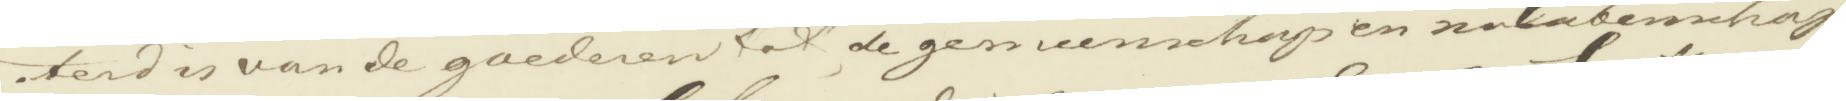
„terd is van de goederen tot de gemeenschap en nalatenschap
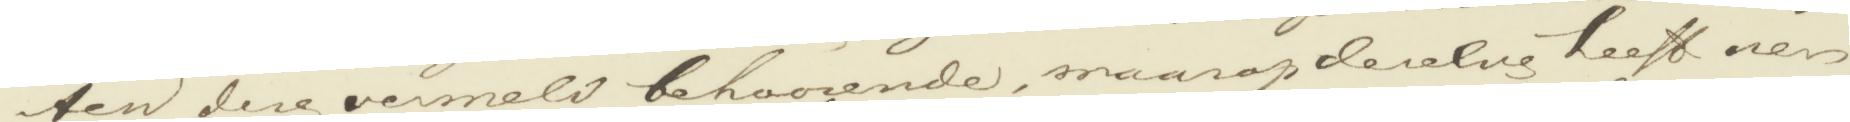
ten deze vermeld behoorende, waarop deselve heeft ver
